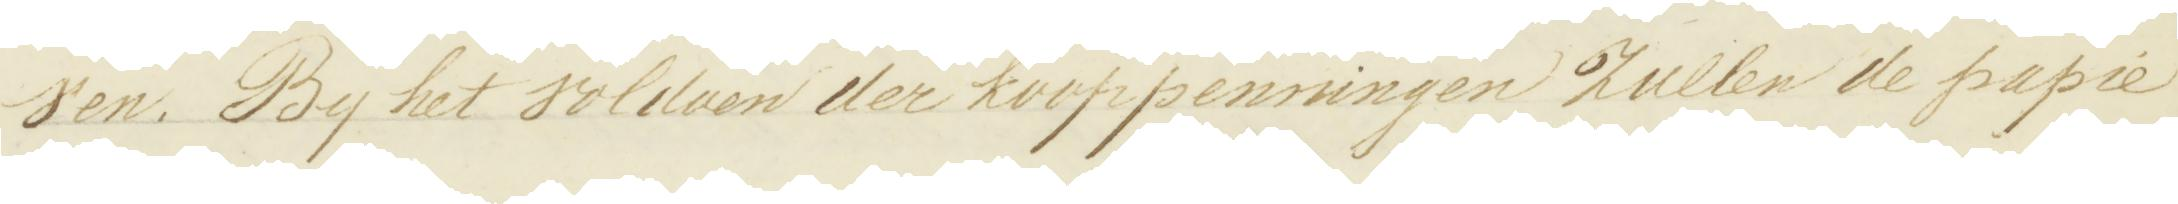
ven. By het voldoen der kooppenningen zullen de papie
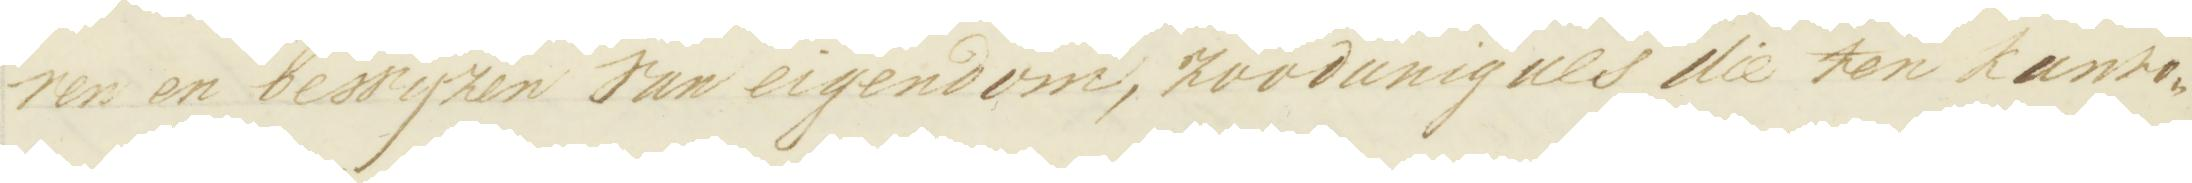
ren en bewyzen van eigendom, zoodanig als die ten kanto„
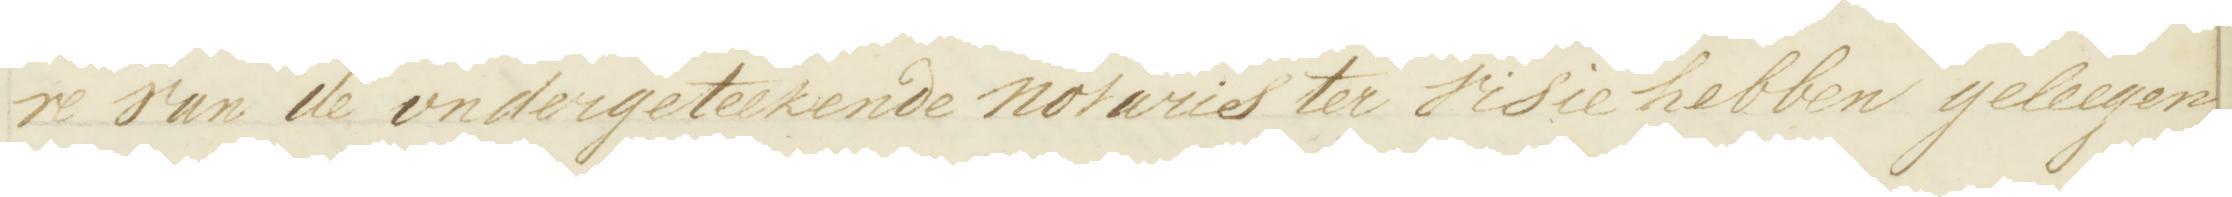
re van de ondergeteekende notaris ter visie hebben geleegen
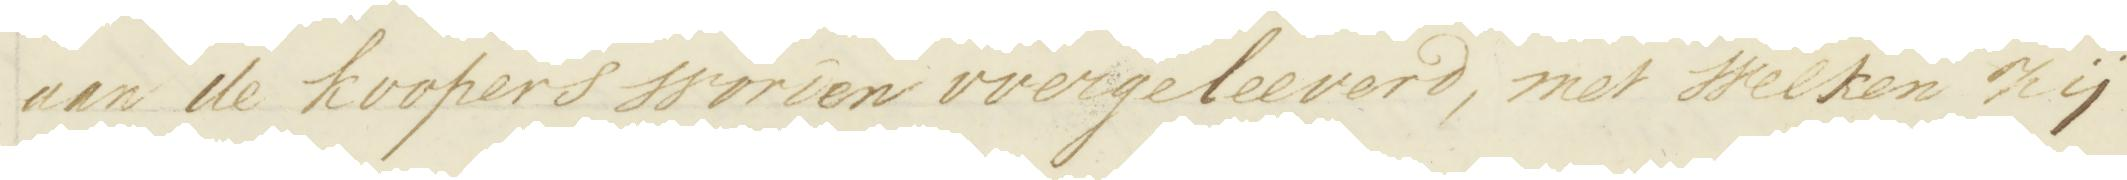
aan de koopers worden overgeleeverd, met welken zij
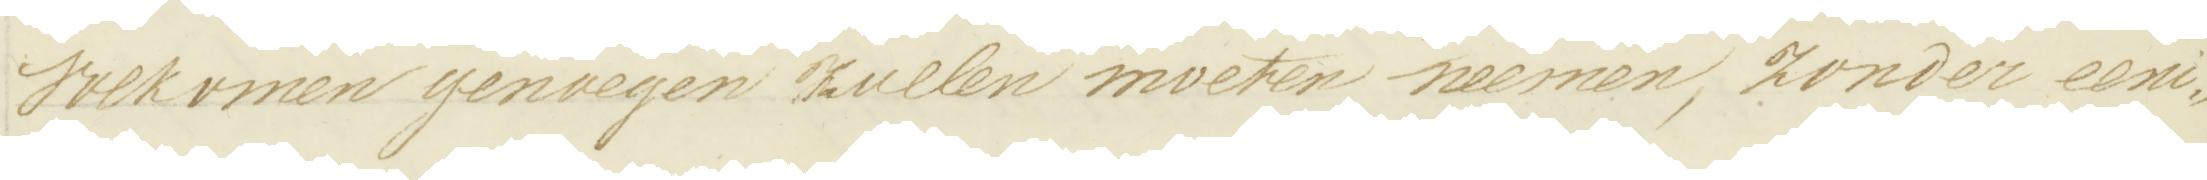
Volkomen genoegen zullen moeten neemen, zonder eeni„
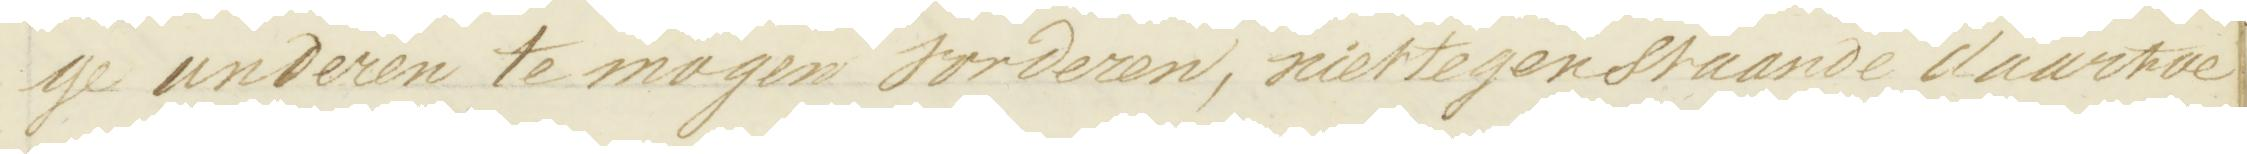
ge anderen te mogen vorderen, niettegenstaande daartoe
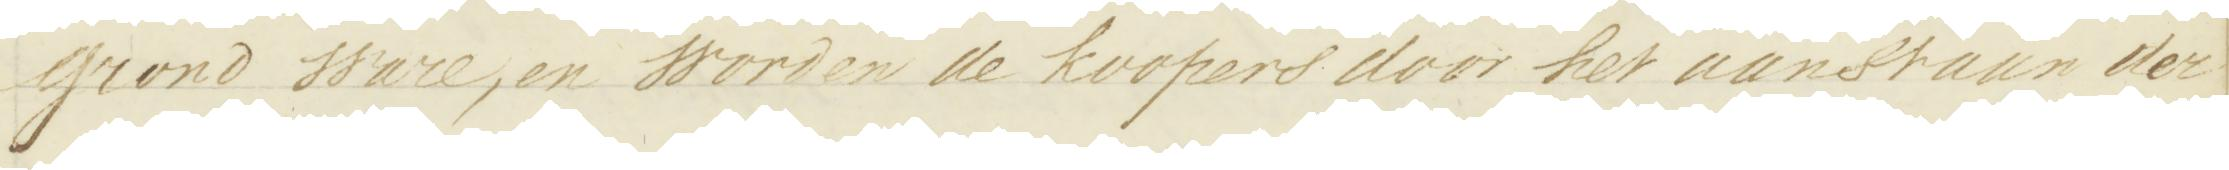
Grond ware, en worden de koopers door het aanstaan der
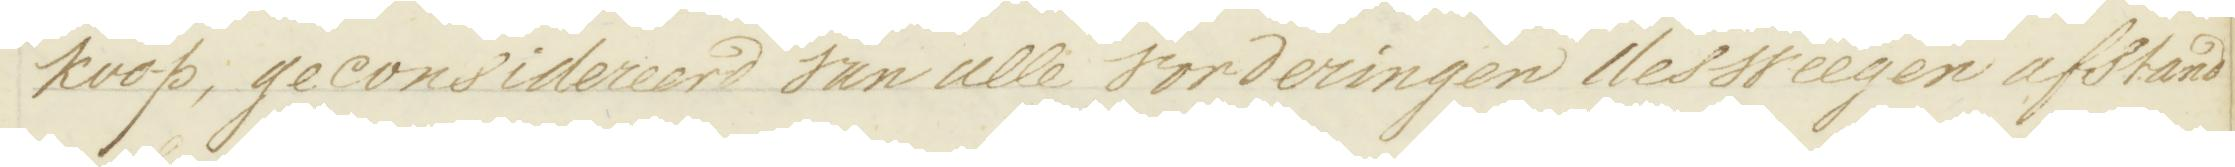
koop, geconsidereerd van alle vorderingen des weegen afstand
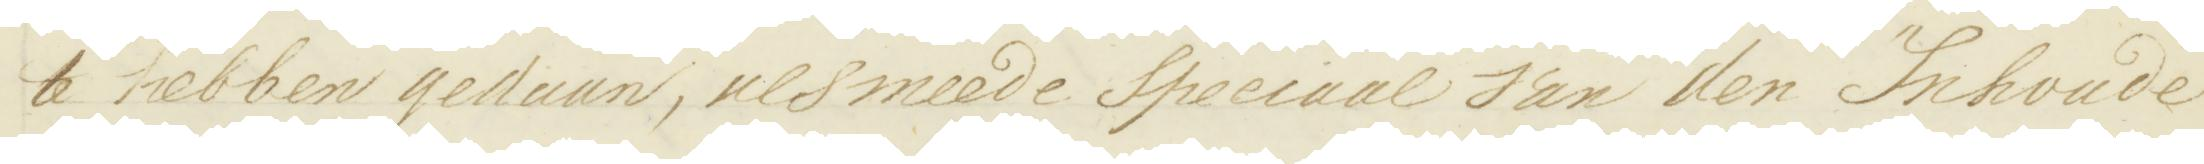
te hebben gedaan, als meede speciaal van den Inhoude
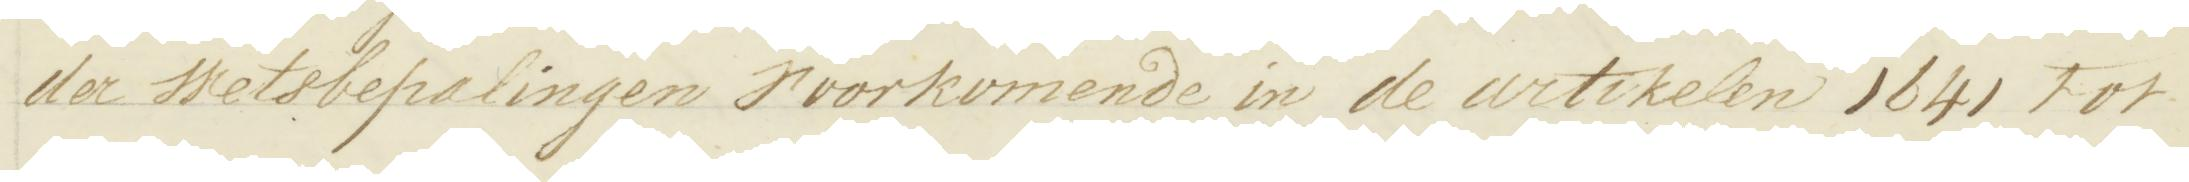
der wetsbepalingen voorkomende in de artikelen 1641 tot
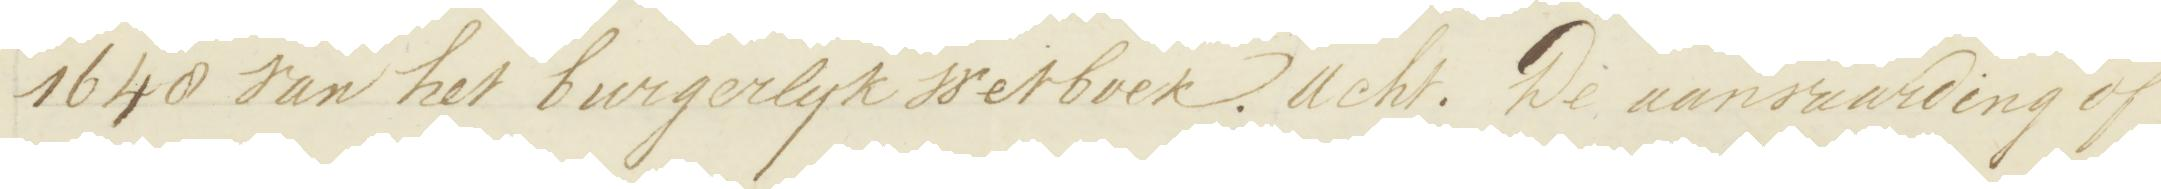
1648 van het burgerlyk wetboek. Acht. De aanvaarding of
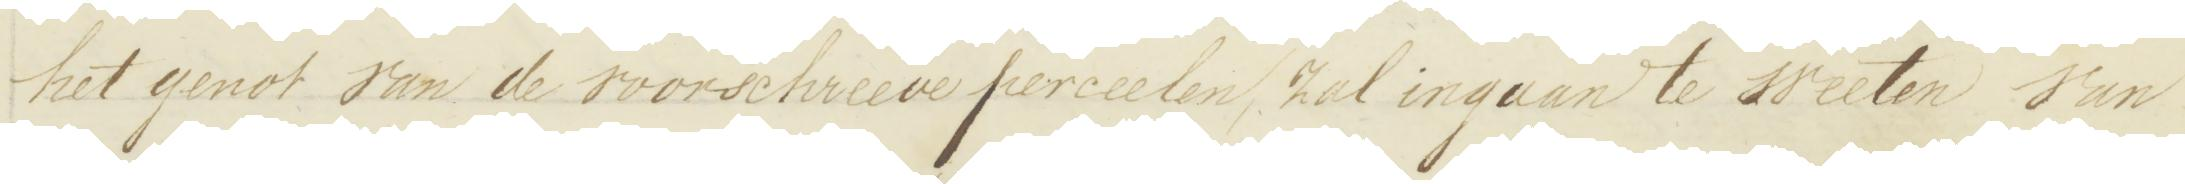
het genot van de voorschreeve perceelen, zal ingaan te weeten van
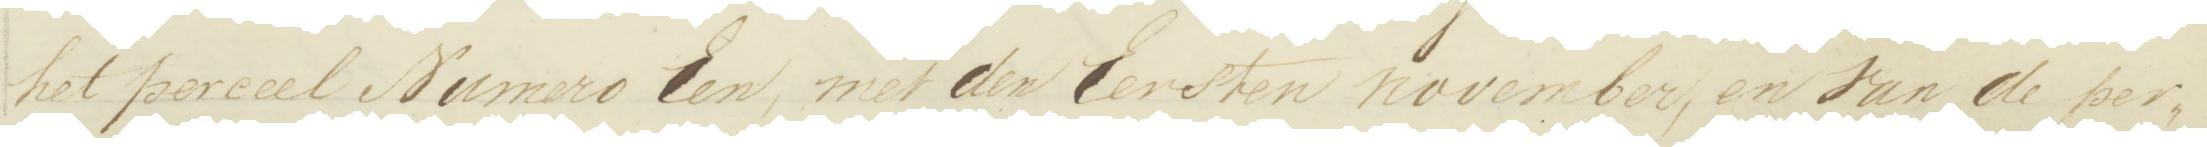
het perceel Numero Een, met den Eersten november, en van de per„
